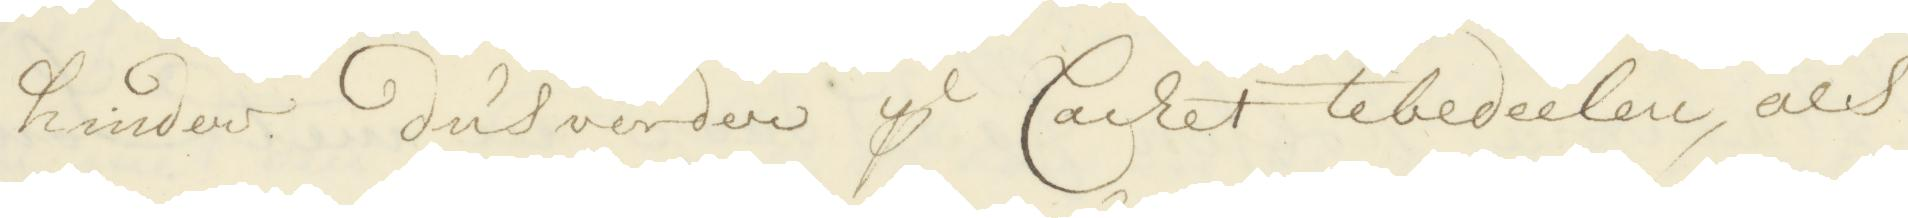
hinder dus verder pl Cachet tebedeelen, als
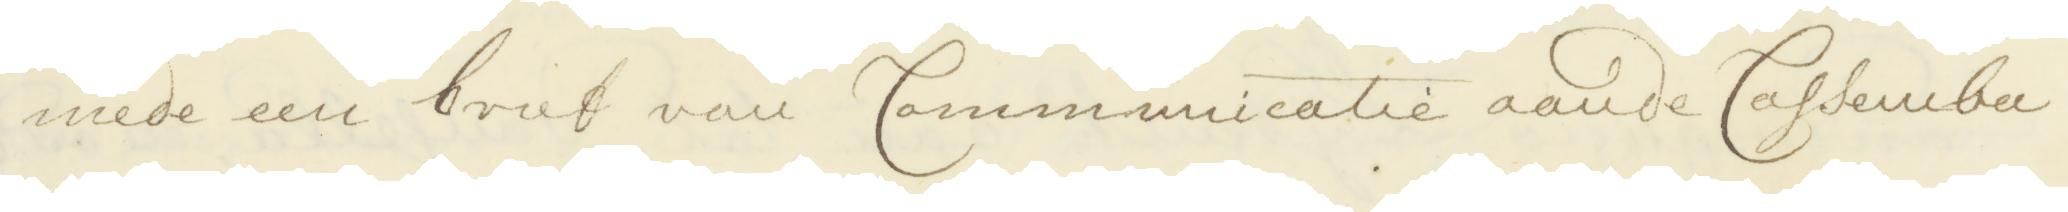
mede een brief van Communicatie aan de Cassemba
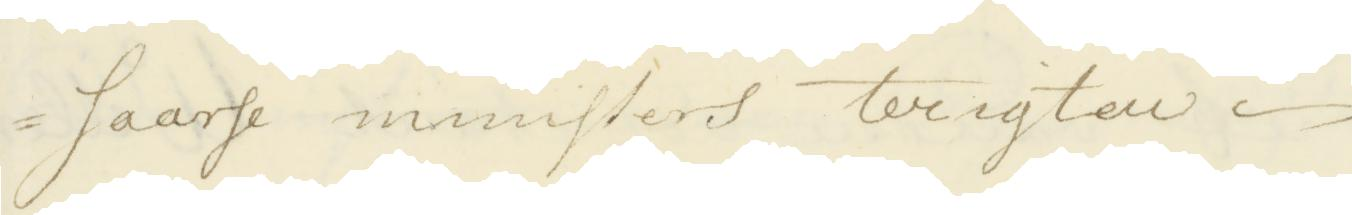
=saarse munsters terigten —
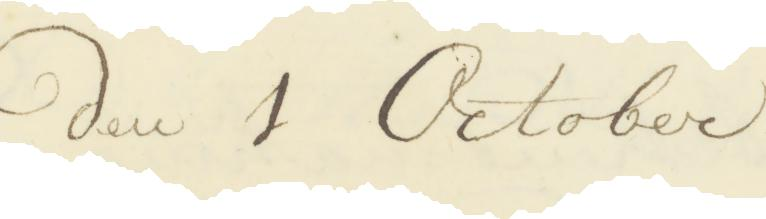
den 1 October
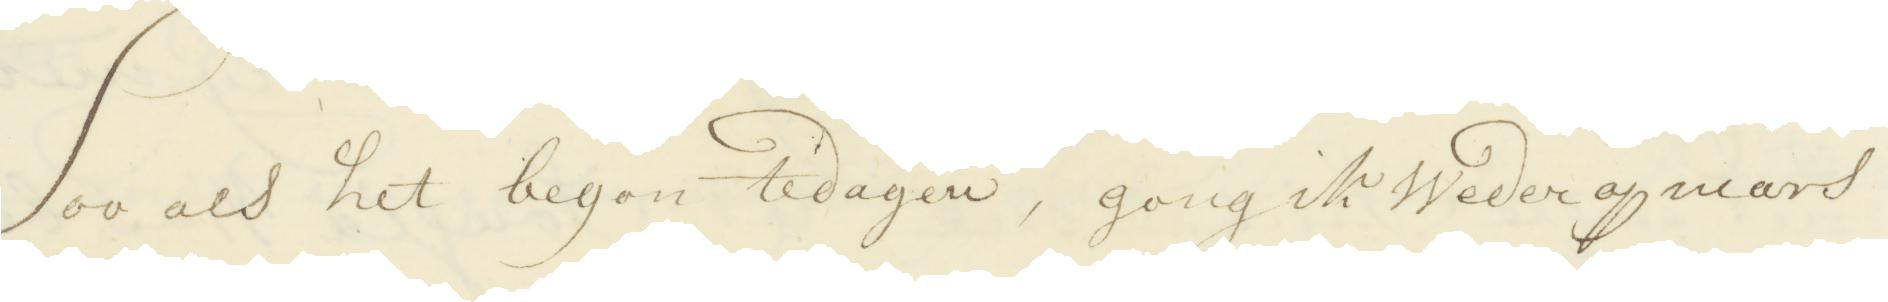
Soo als het begon tedagen, gong ik weder opmars
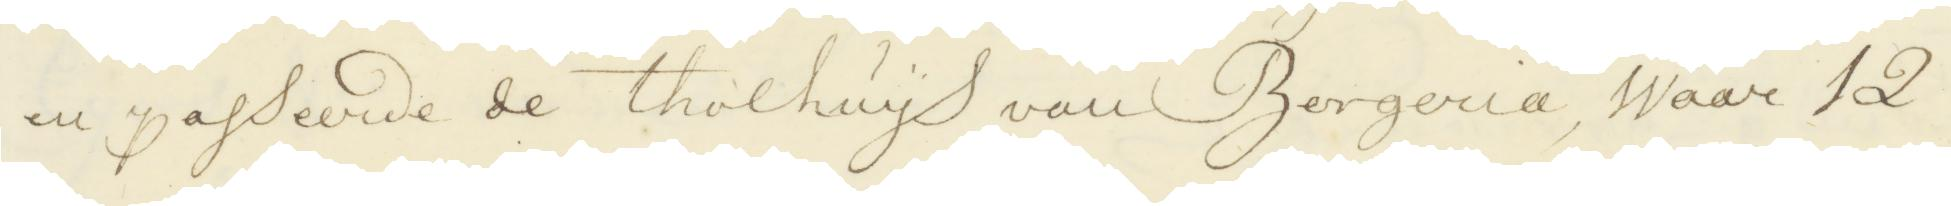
en passeerde de tholhuijs van Bergeria, waar 12
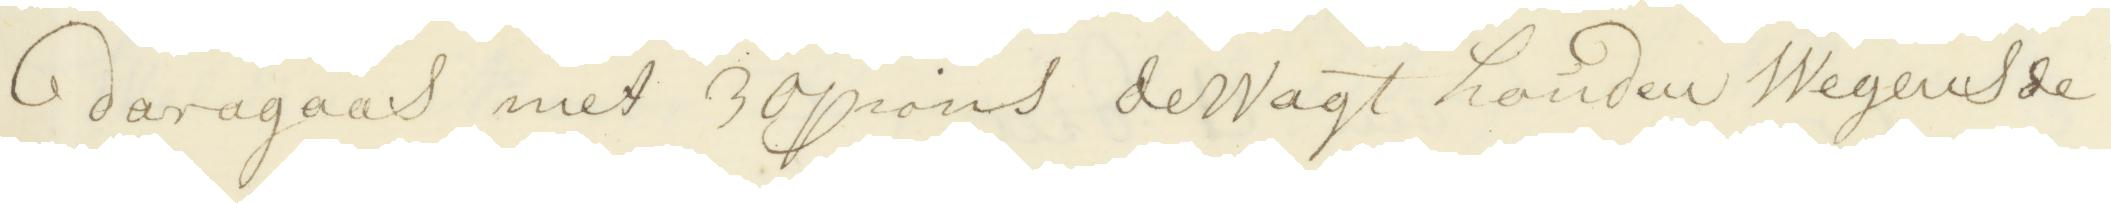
daragaas met 30 pions dewagt houden wegens de
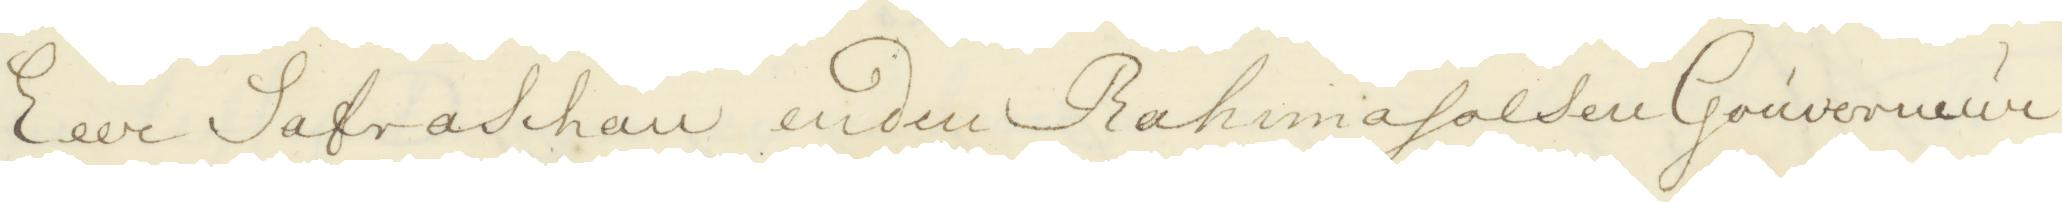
heer Safraschan enden Rahimasolsen Gouverneur
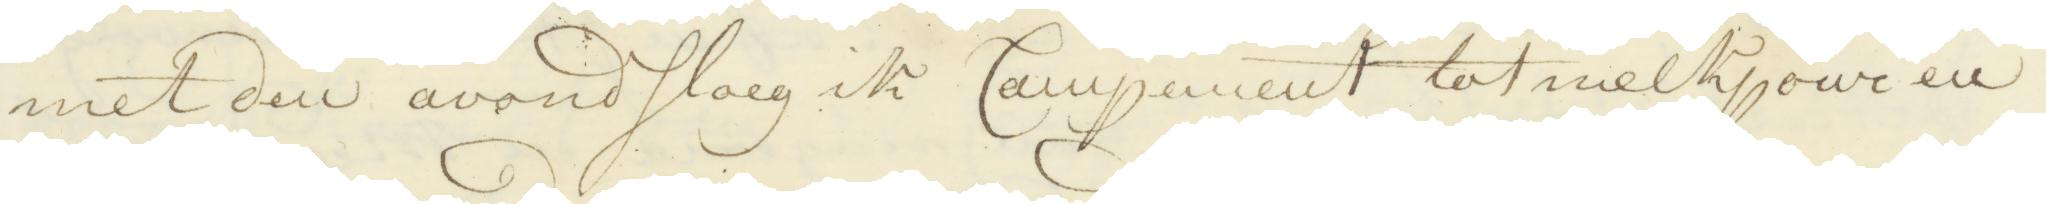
met den avond sloeg ik Campement tot melkpour en
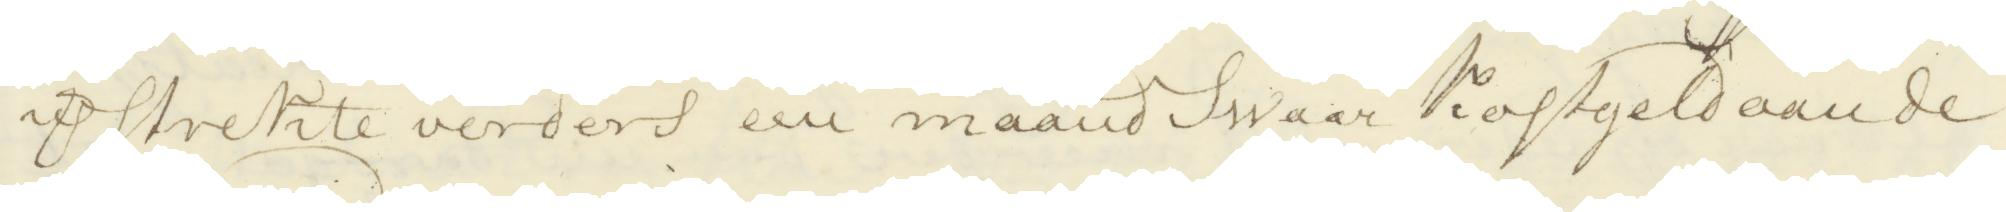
verstrekte verders een maand swaar kostgeld aan de
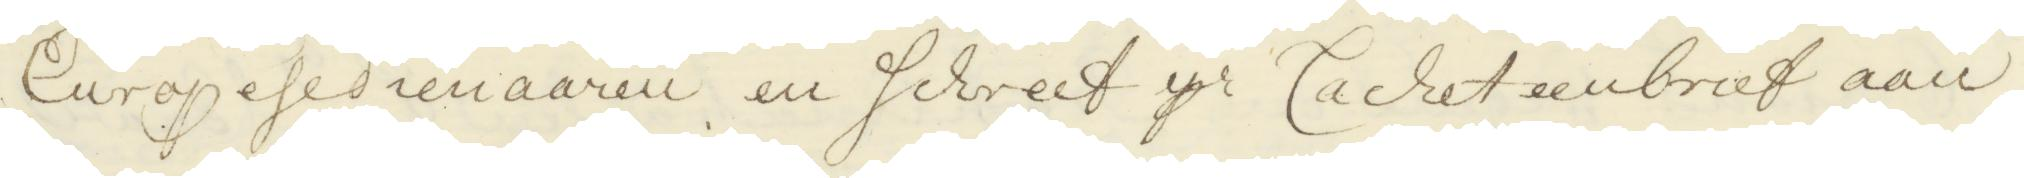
Europese dienaaren en schreef pr Cachet een brief aan
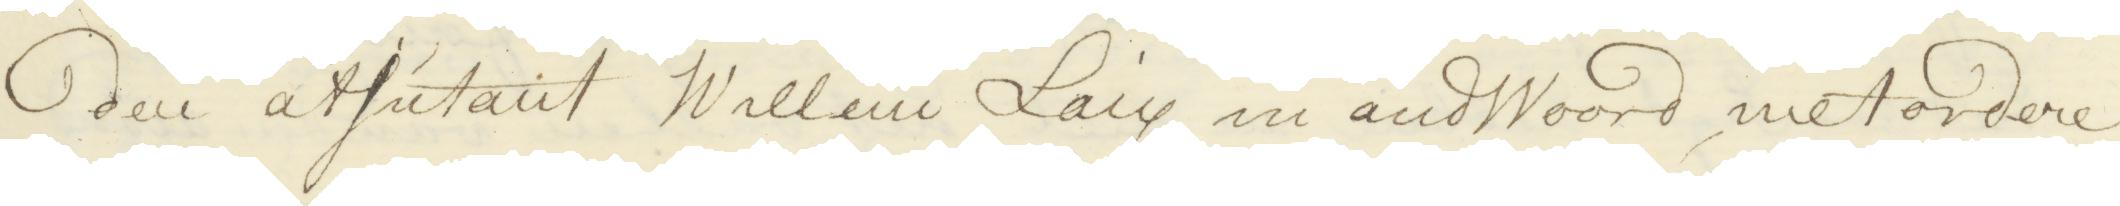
den atsutant Willem Laix in andwoord met ordere
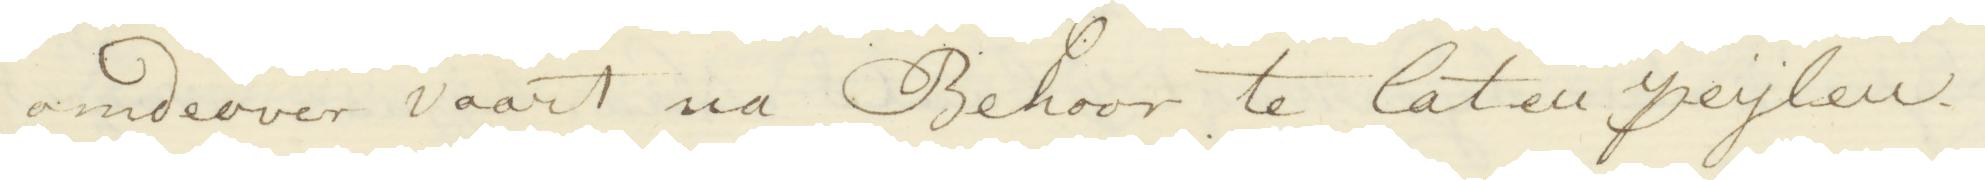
omdeover vaart na Behoor te laten peijlen.
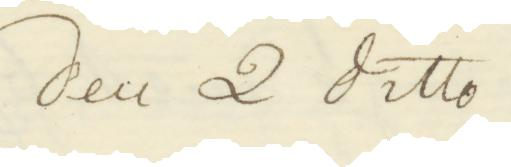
den 2 ditto
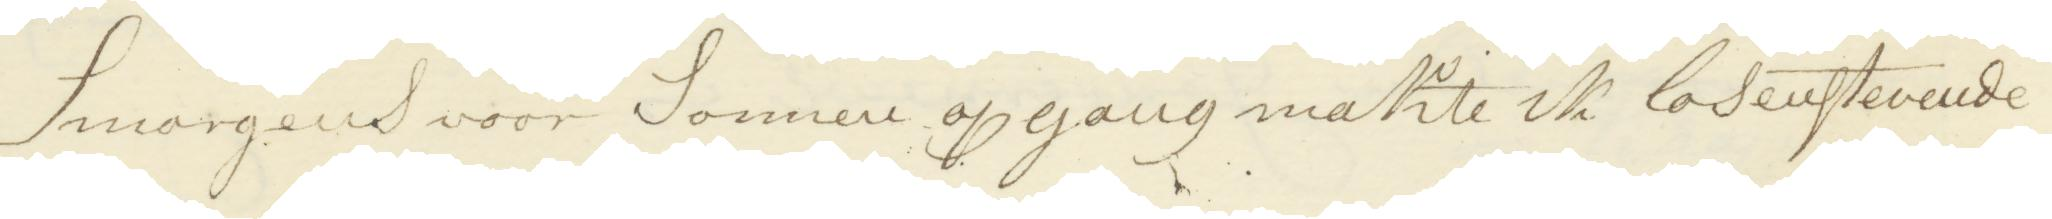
Smorgens voor Sonnen opgang makte ik los enstevende
